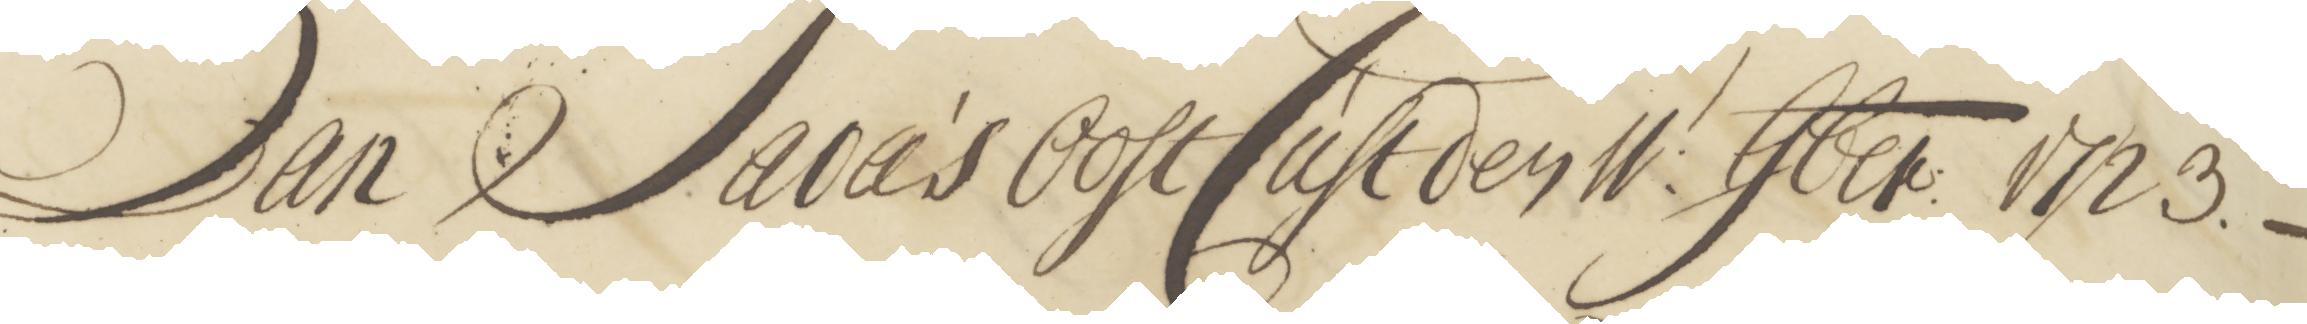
Van Java's Oost Cust den 11:' 9ber: 1723. —
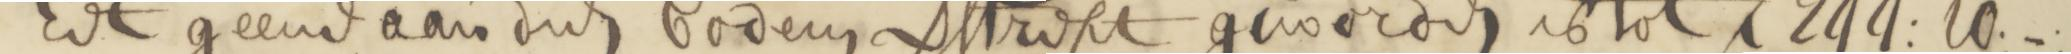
het geene aan dien bodem verstrekt geworden is tot ƒ 244: 10: - :
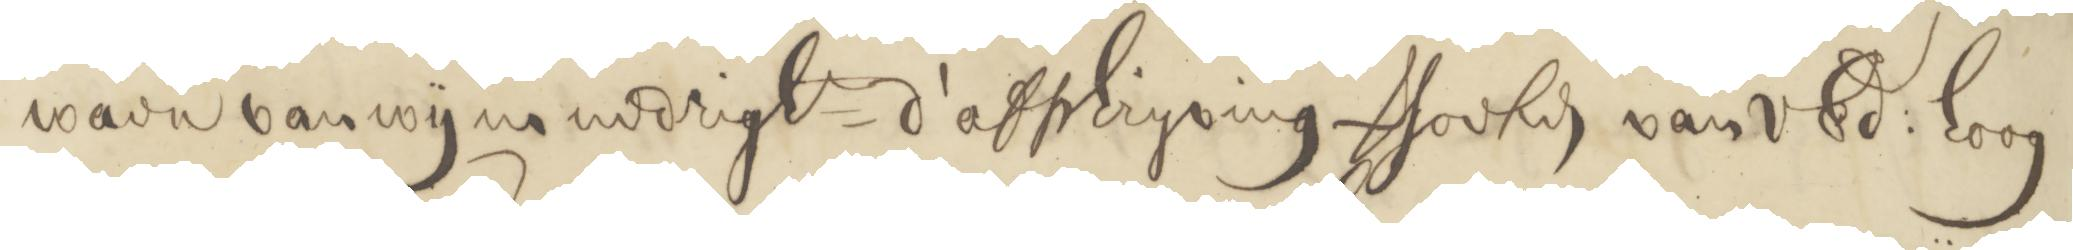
waervan wij in nedrigh=t d’ afschrijving versoeken van v Ed: hoog
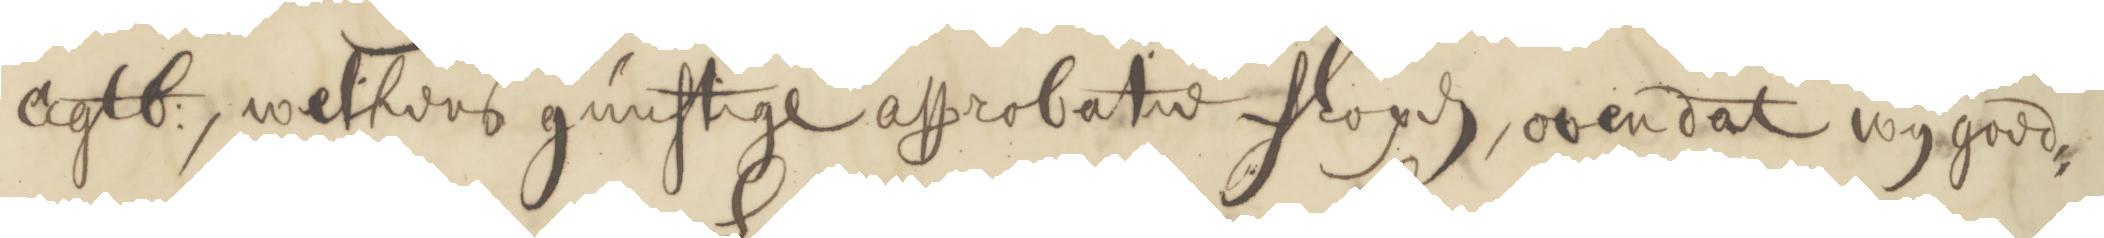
agtb:, welkers gunstige approbatie verhopen, over dat wij goed„
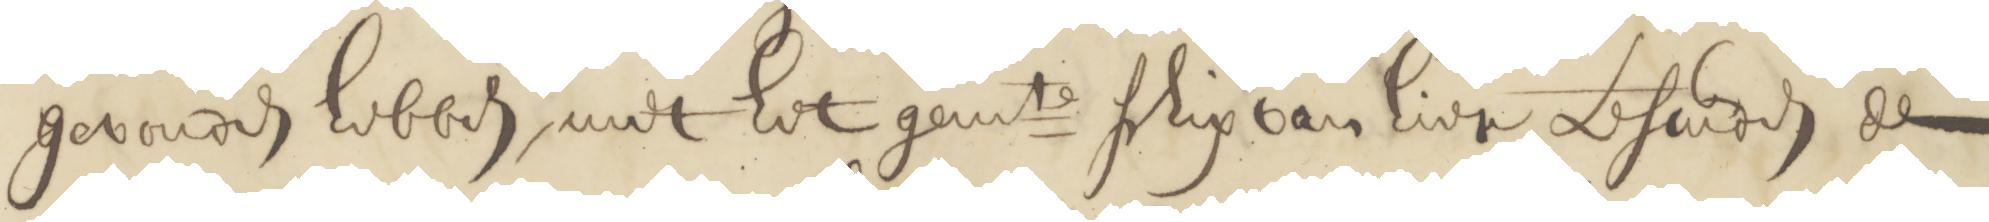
gevonden hebben, met het gem=te schip van hier te senden de
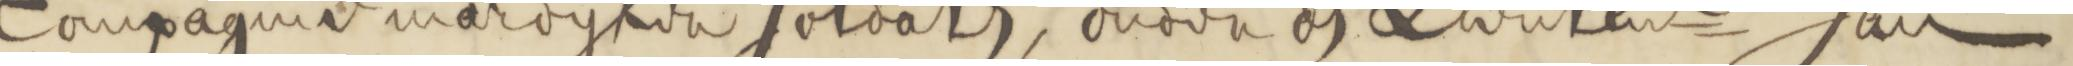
Compagnie mardijker Soldaten, onder den Lieuten=t Jan
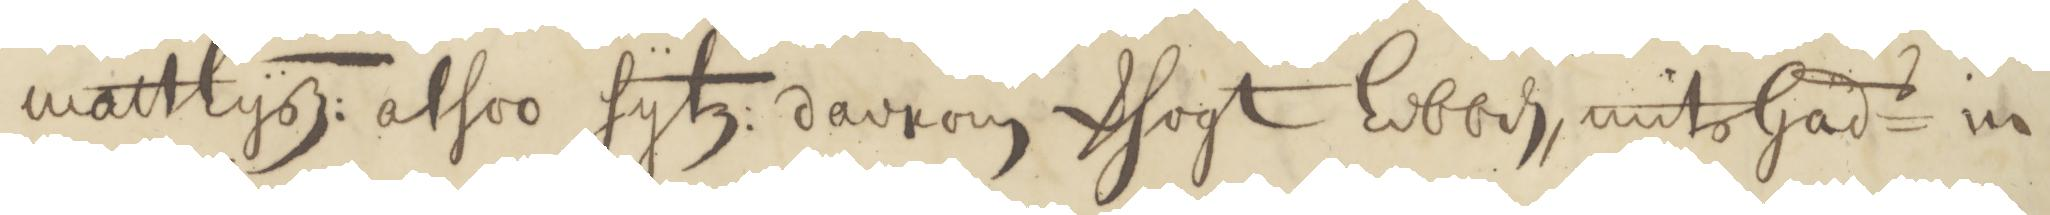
matthijsz: alsoo sij tz: daerom versogt hebben, mitsgad=s in
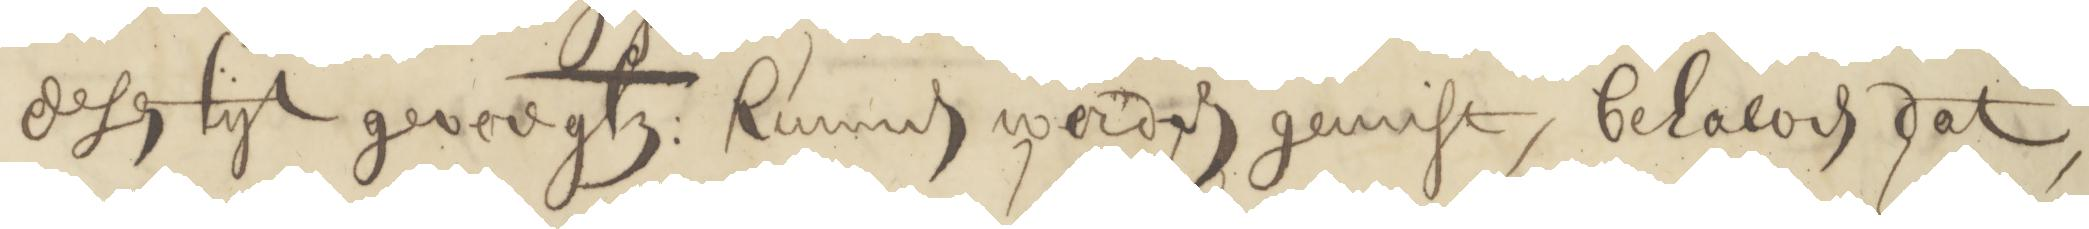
desen tijt gevoegtz: kunnen werden gemist, behalven dat,
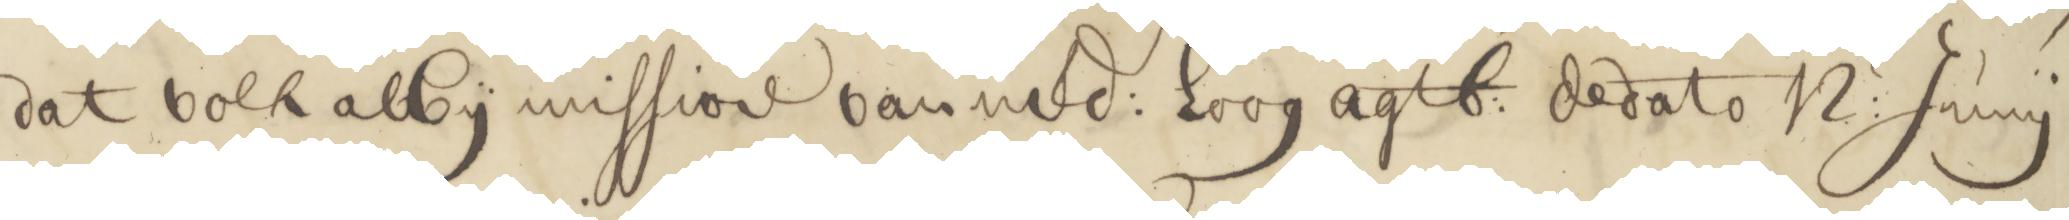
dat volk albij missive van uEd: hoog agtb: de dato 12:' Junij
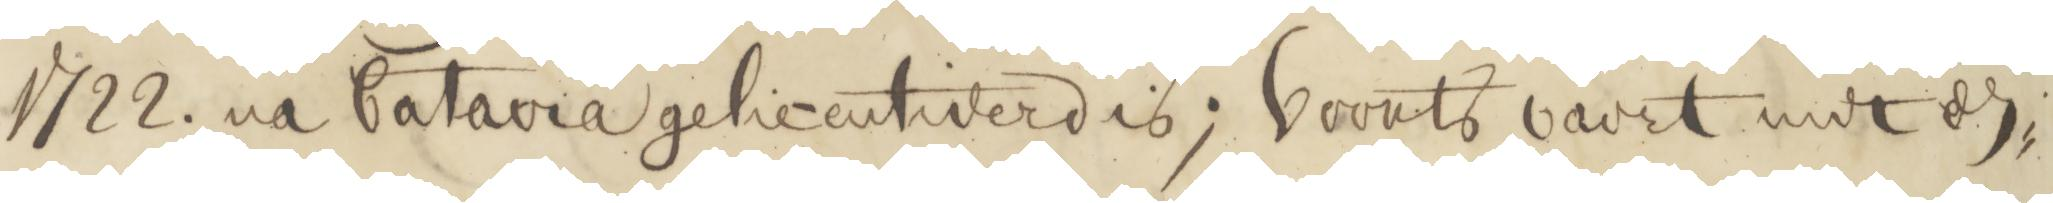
1722. na batavia gelicentieerd is; voorts vaert met den„
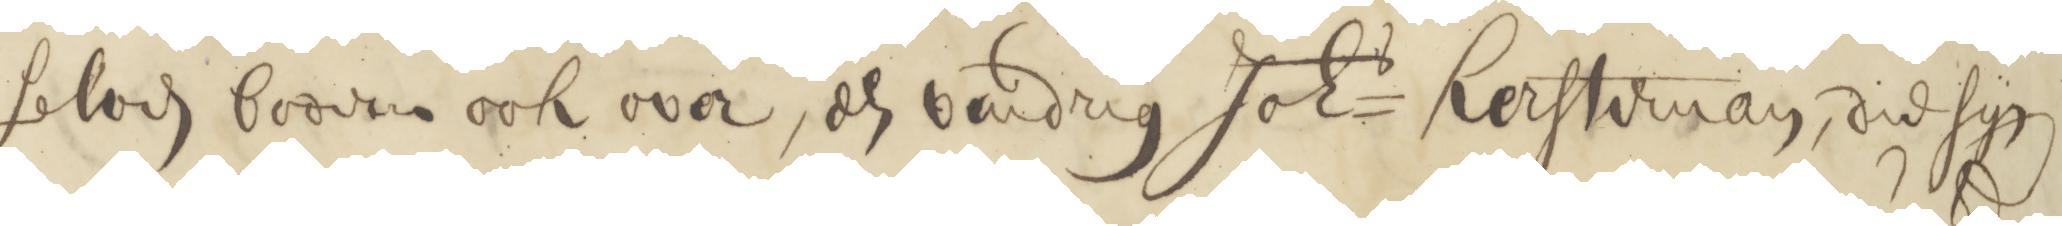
selven bodem ook over, den vendrig Joh=s Kersteman, die sijn
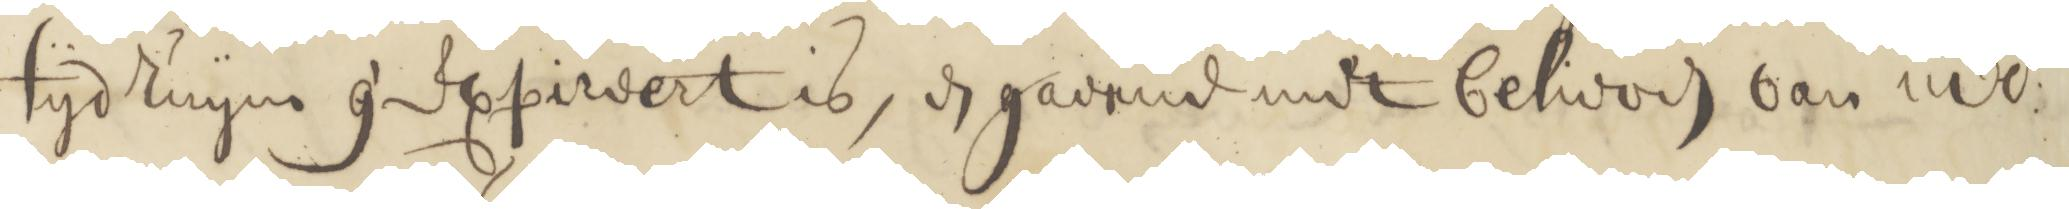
tijd ruijm g’Expireert is, en gaerne met believen van uEd:
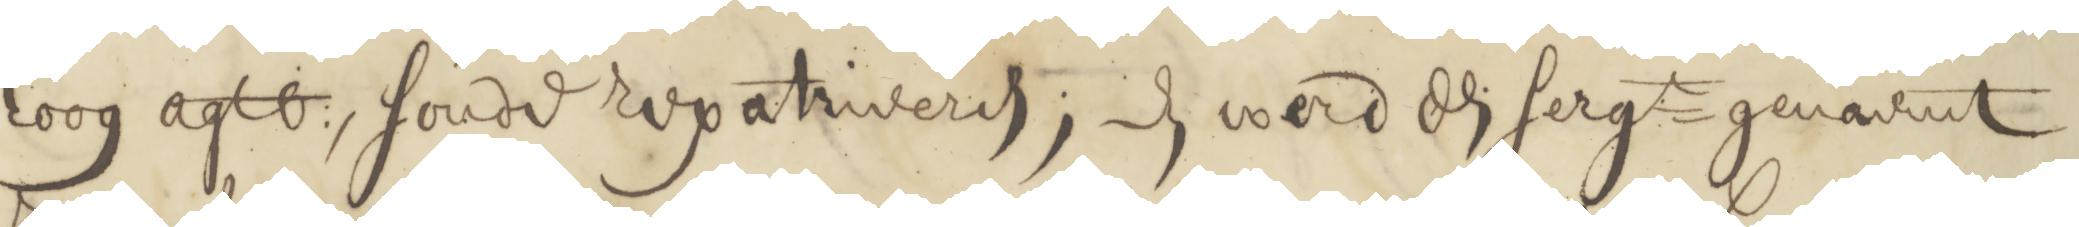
hoog agtb:, soude repatrieeren; en werd den serg=t genaemt
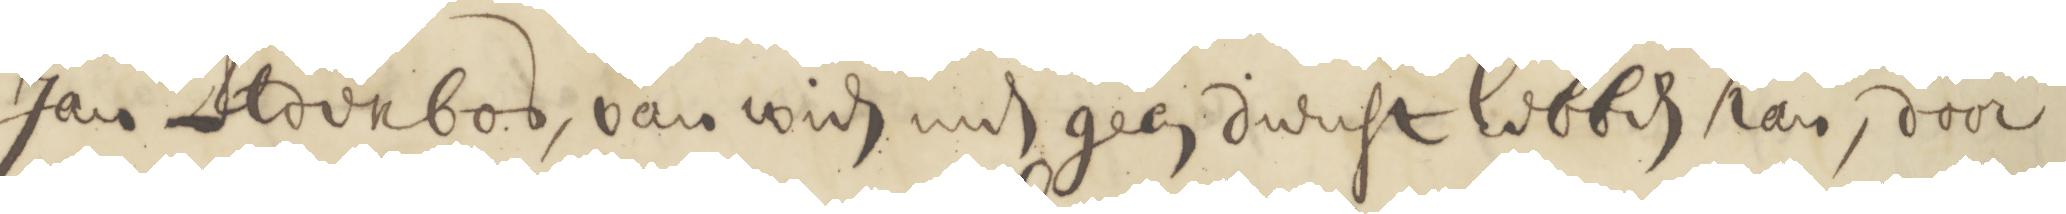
Jan Elderbos, van wien men geen dienst hebben kan, door
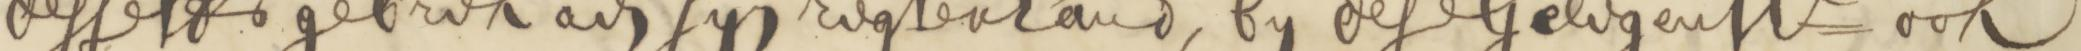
desselfs gebrek aen sijn regterhand, bij dese Gelegenth=t ook
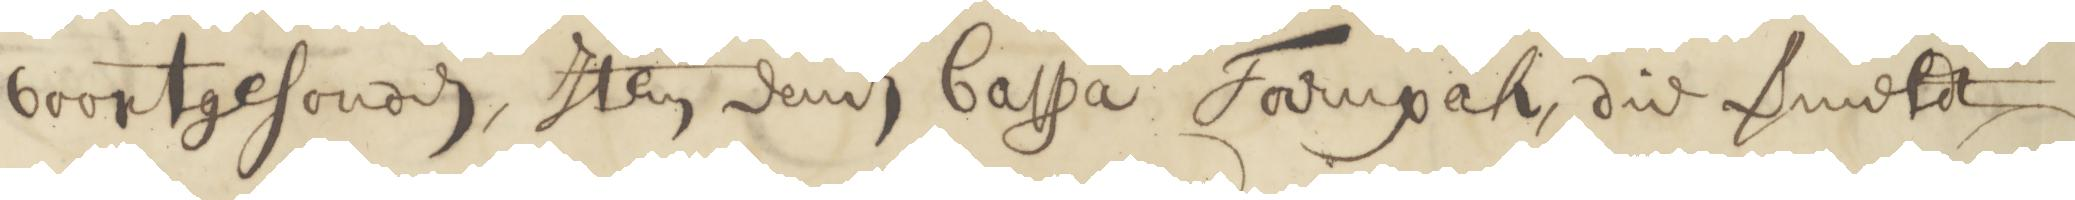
voortgesonden, Item eenen bappa Toempak, die vermeldt
